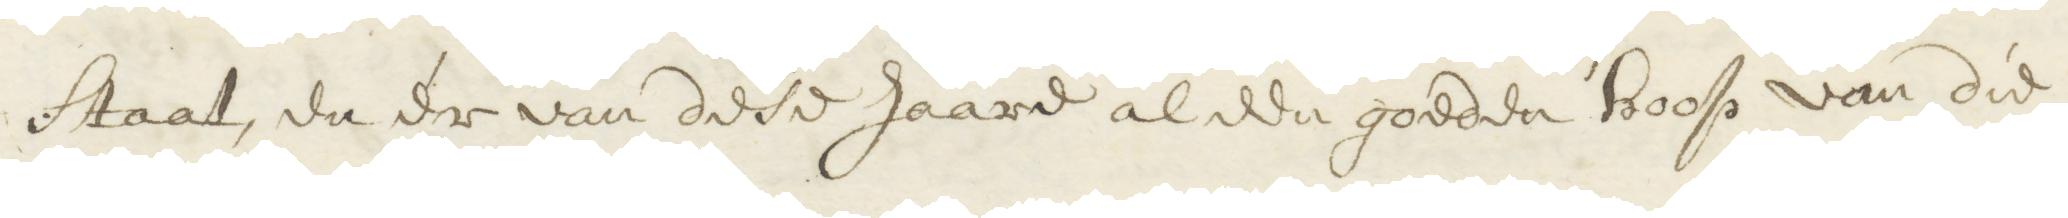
staat, en 'er van dese Jaare al een goeden hoop van die
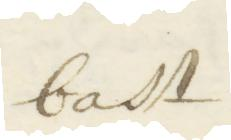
bast
